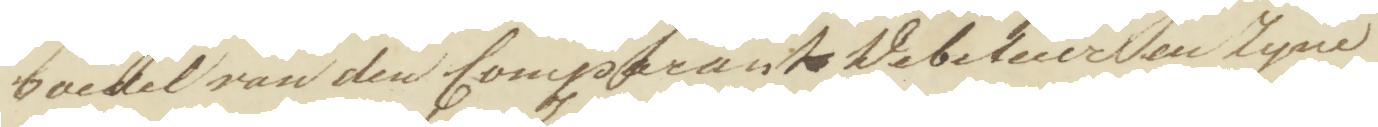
boedel van den Comparant Debiteur en zyne
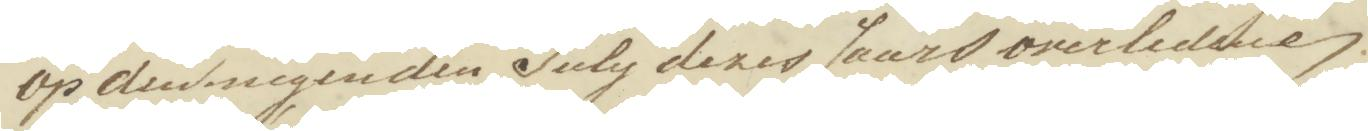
Op den negenden Iuly dezes Jaars overledene —
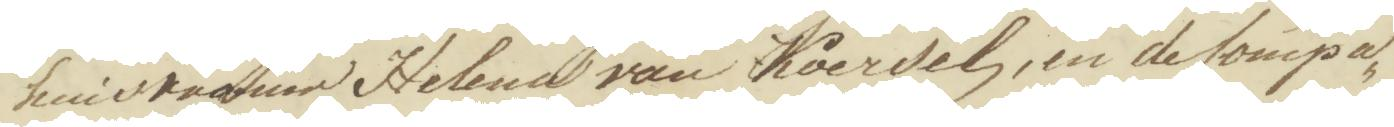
huisvrouw Helena van Koersel, en de Compa„
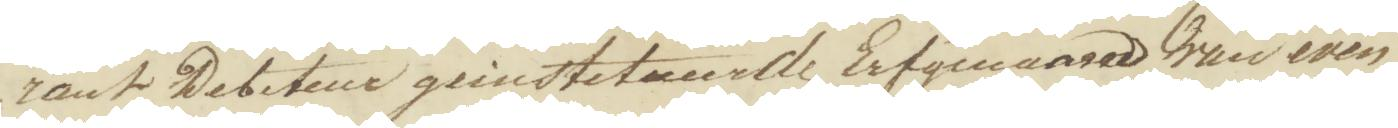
„rant Debiteur geinstitueerde Erfgenaam van even
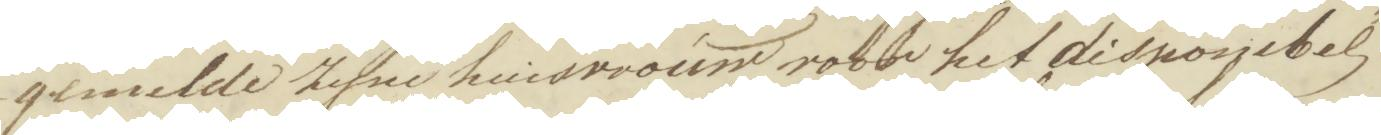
gemelde zyne huisvrouw voor het disponibel
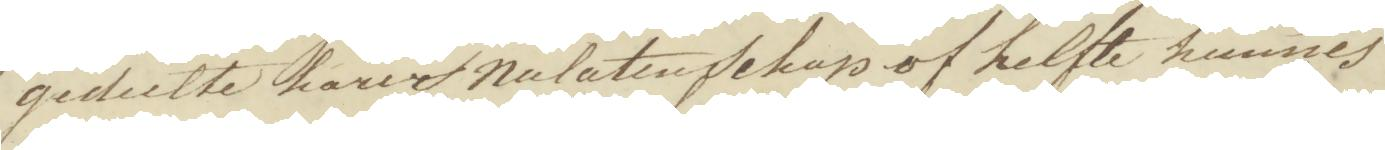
gedeelte harer Nalatenschap of helfte hunnes
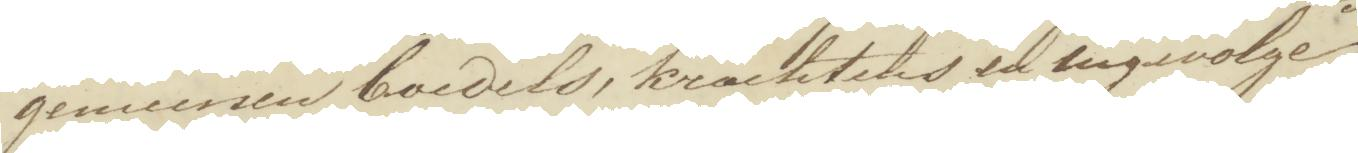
gemeenen boedels, krachtens en ingevolge —
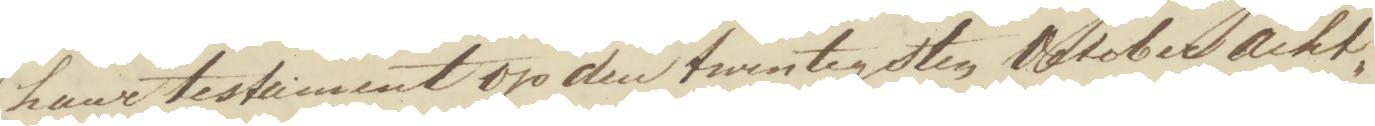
haar testement op den twintigsten October Acht„
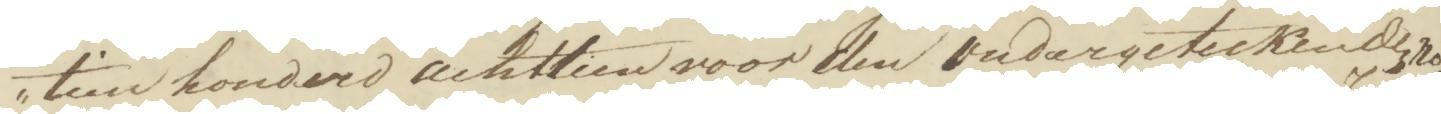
„tien honderd achttien voor den ondergeteekende no
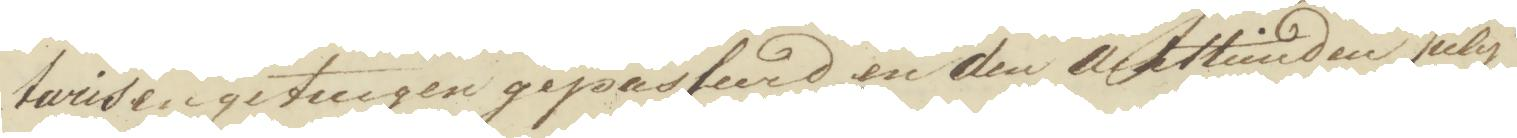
„taris en getuigen gepasseerd en den Achttienden July
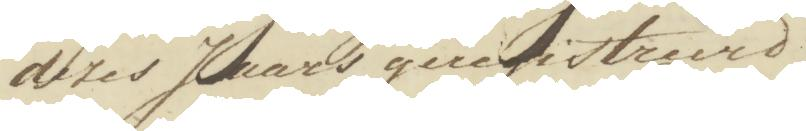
dezes Jaars geregistreerd
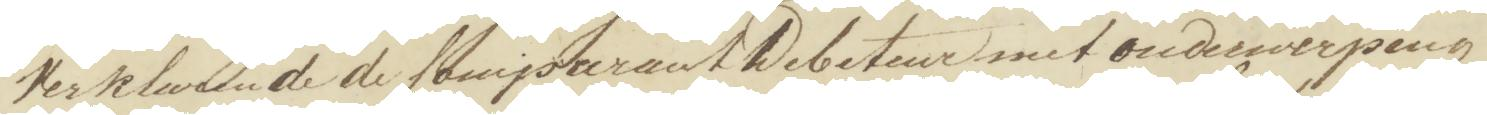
Verklarende de Comparant Debiteur met onderwerping
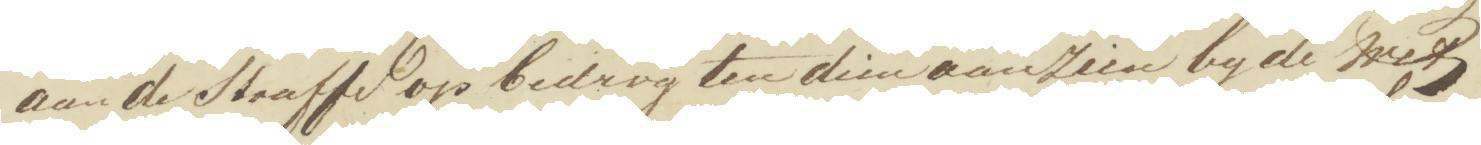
aan de straffe op bedrog ten dien aanzien by de Wet
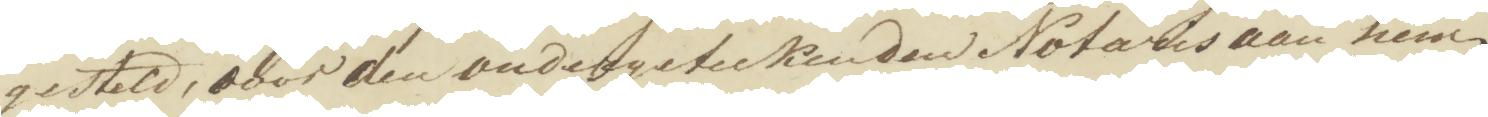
gesteld, door den ondergeteekenden Notaris aan hem
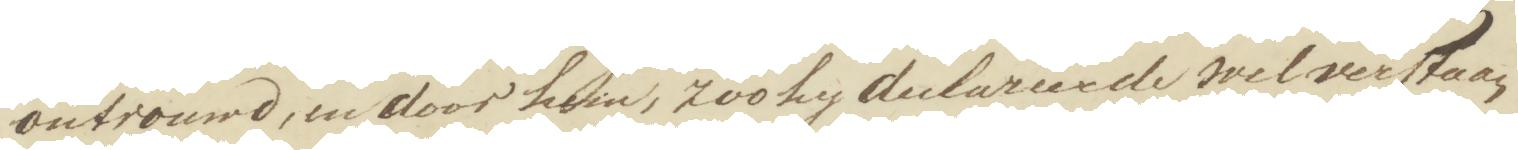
ontvouwd, en door hem, zoo hy declareerde wel verstaan
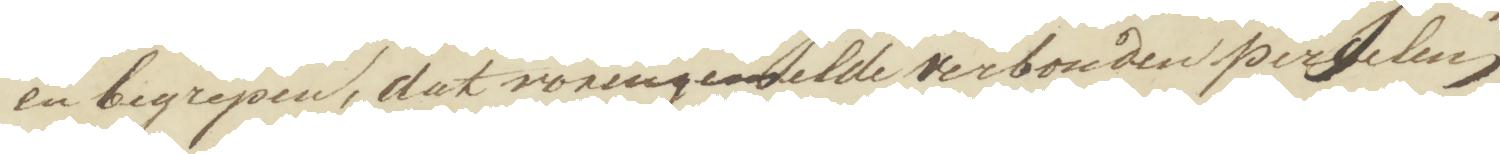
en begrepen, dat vorengemelde verbonden percelen
